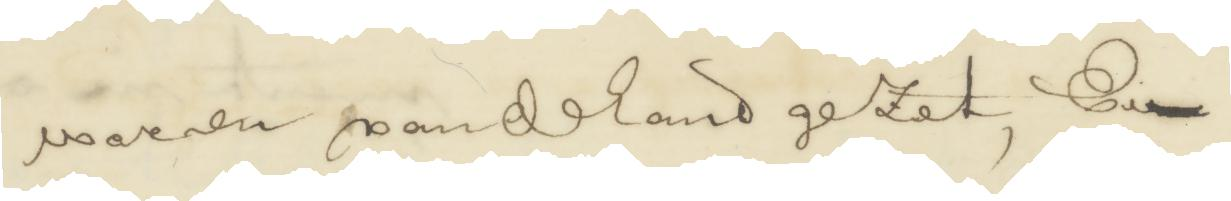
waren van de hand gezet, En
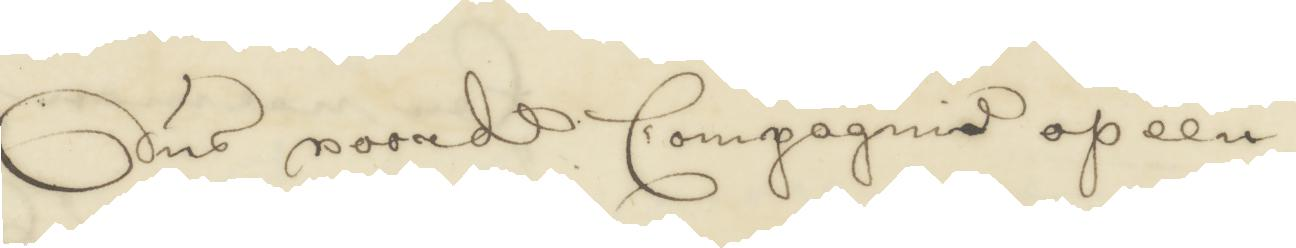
dus voor de Compagnie op een
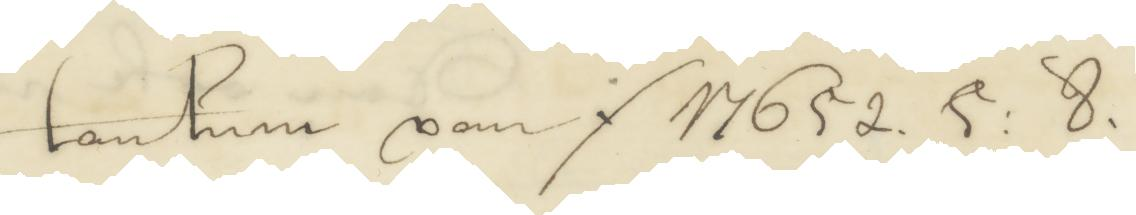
tantum van ƒ 17652.5:8.
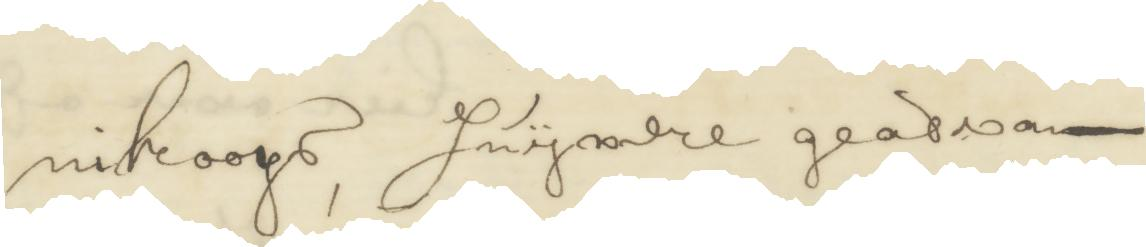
inkoops Suijvere geadvan
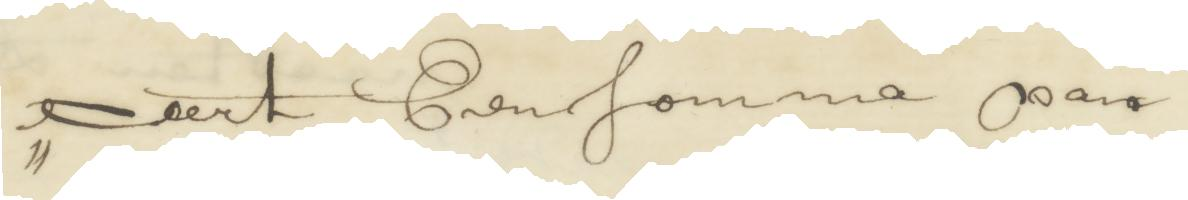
„ceert Een somma van
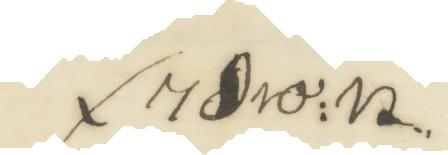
ƒ7810:12.
